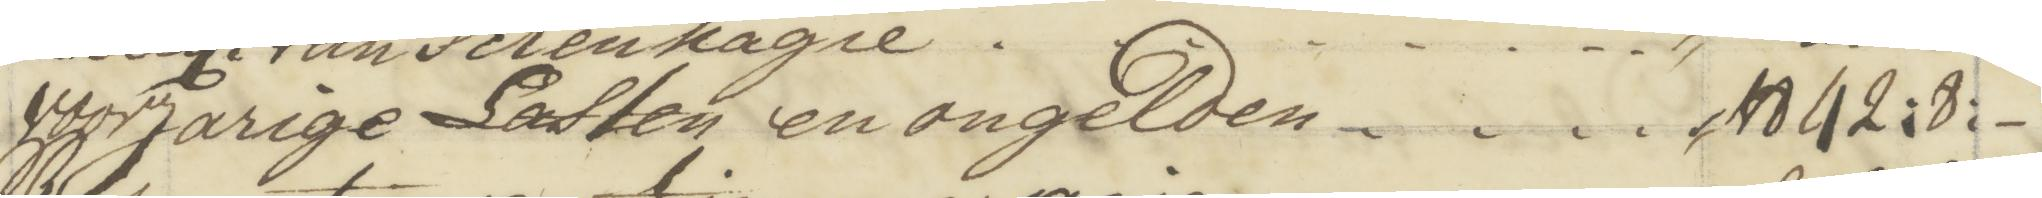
voorjarige Lasten en ongelden - - - - „ 1842: 8: —
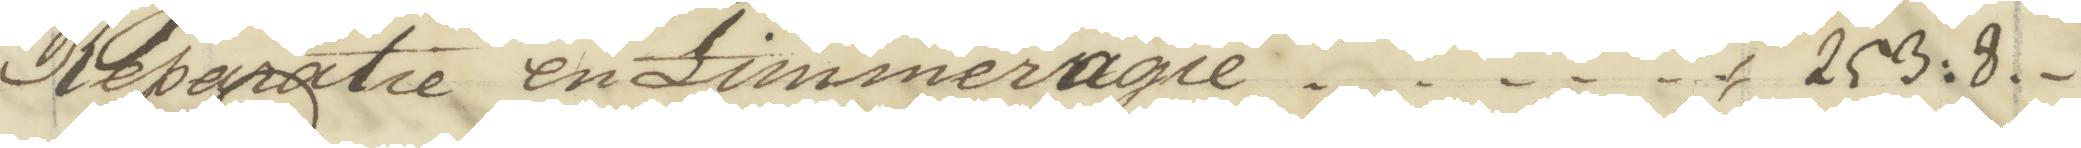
Reparatie en timmeragie - - - - - - „ 253: 8. —
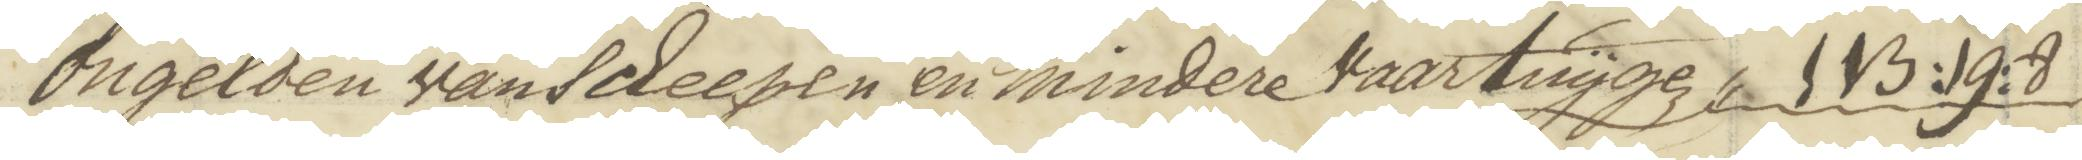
Ongelden van scheepen en Mindere Vaartuijgen „ 113: 19: 8
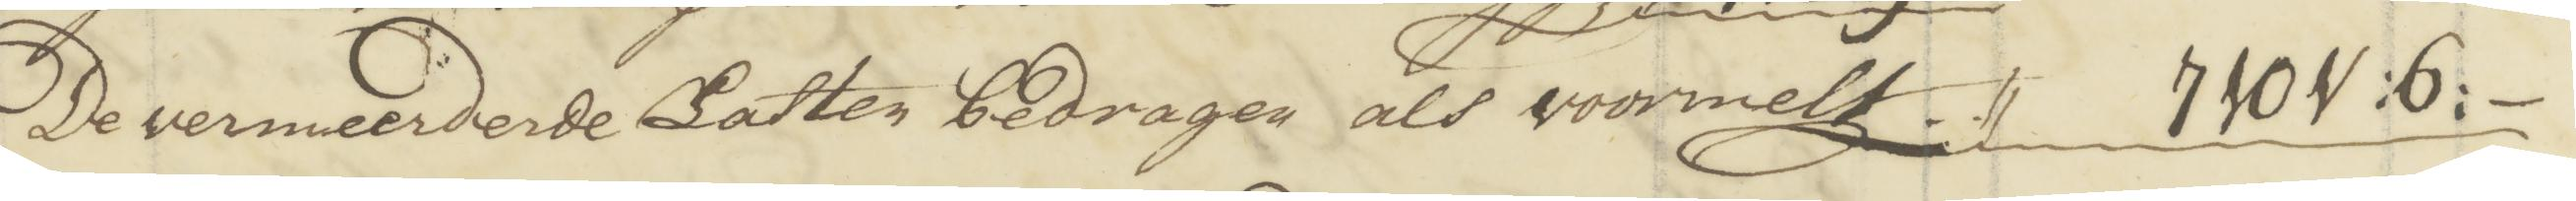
De vermeerderde Lasten bedragen als voormelt - - „ 7101: 6: —
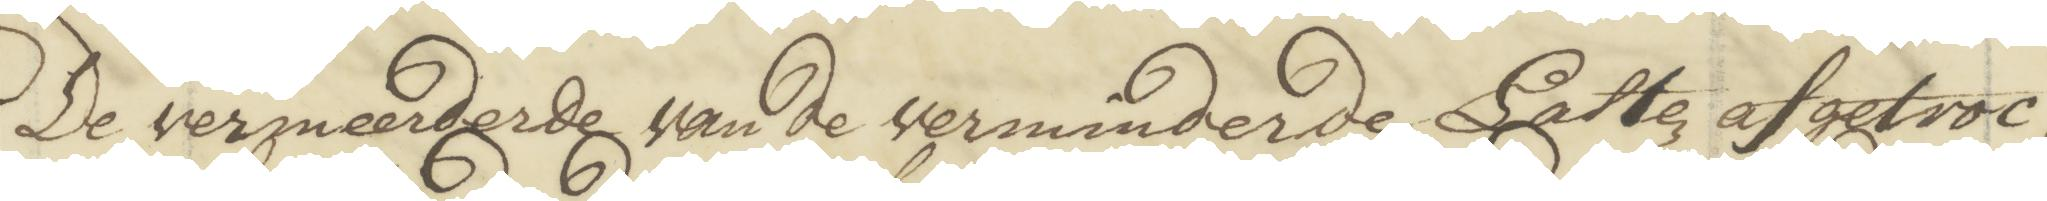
De vermeerderde van de verminderde Lasten afgetroc„
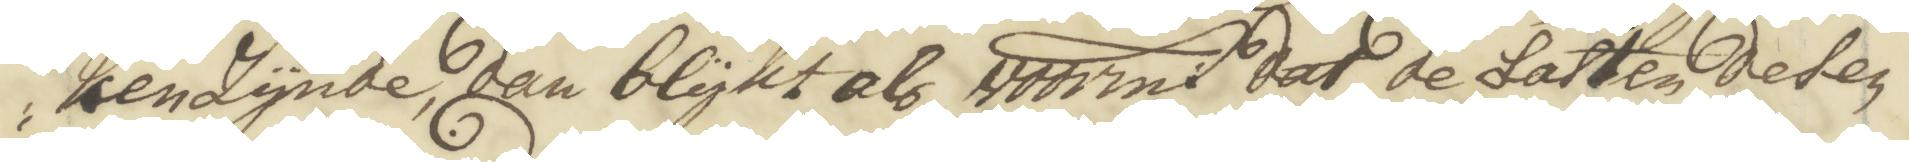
„ken zijnde, dan blijkt als voorn: dat de Lasten desen
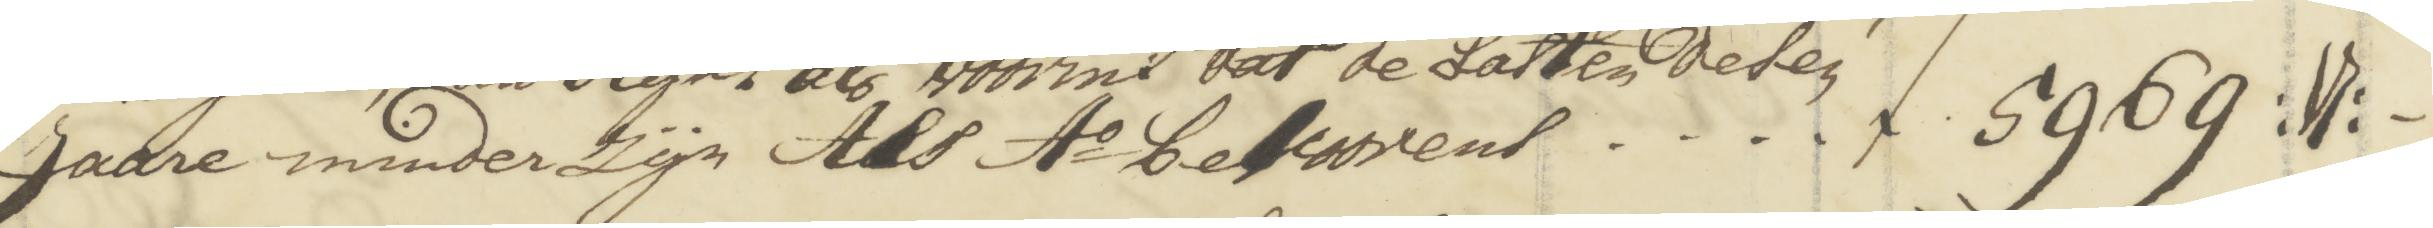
Jaare minder zijn Als A=o bevoorens - - - - ƒ 5969: 17: —
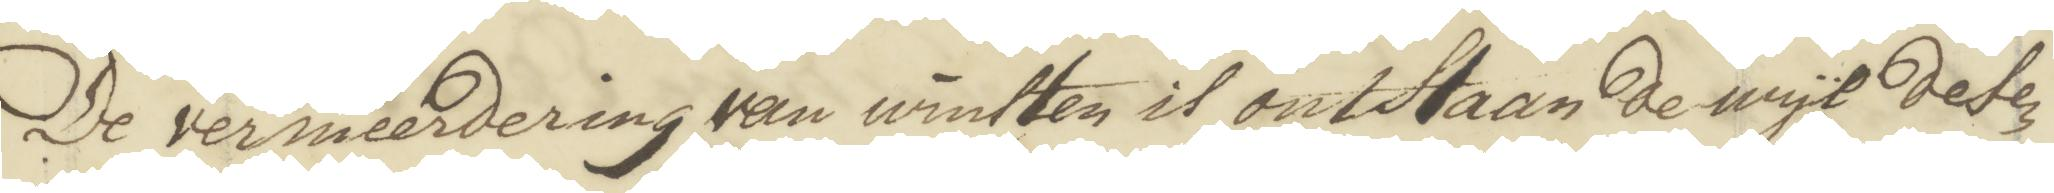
De vermeerdering van winsten is ontstaan de wijl desen
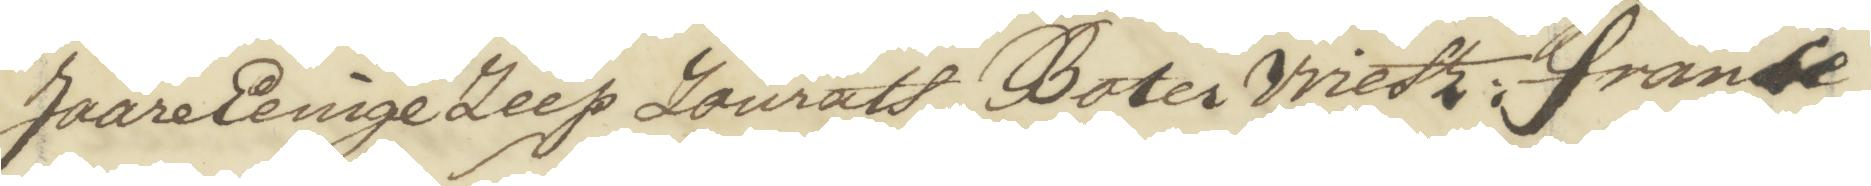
Jaare Eenige zeep zourats, Boter Vrieszt: France
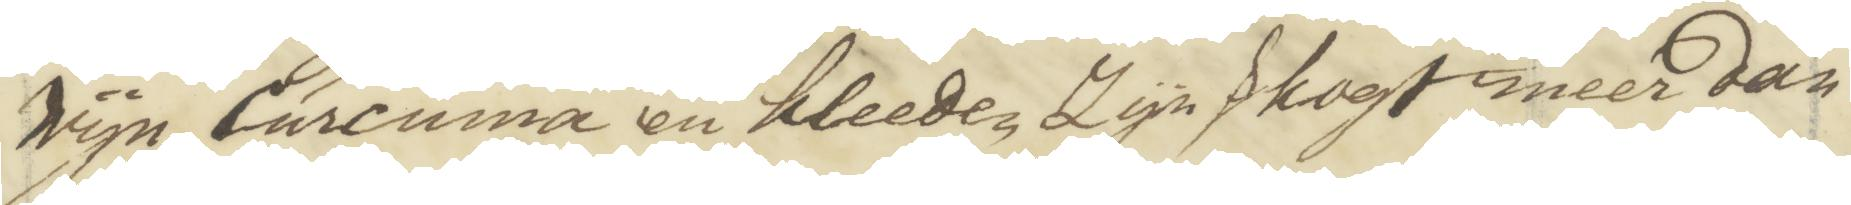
Wijn, Curcuma en kleeden zijn verkogt meer dan
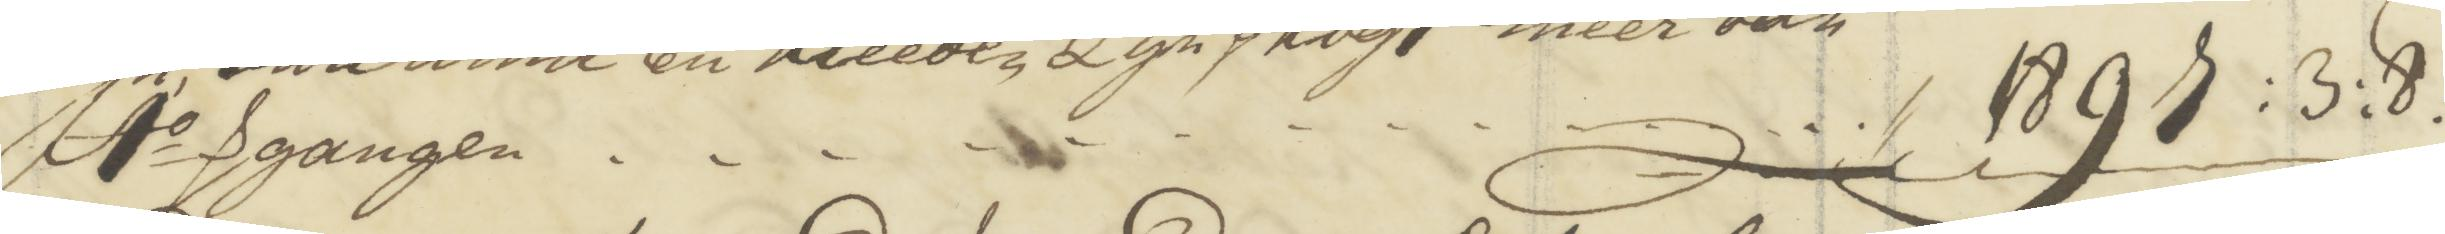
A=o vergangen - - - - - - - - - - - - - - - „1897: 3: 8.
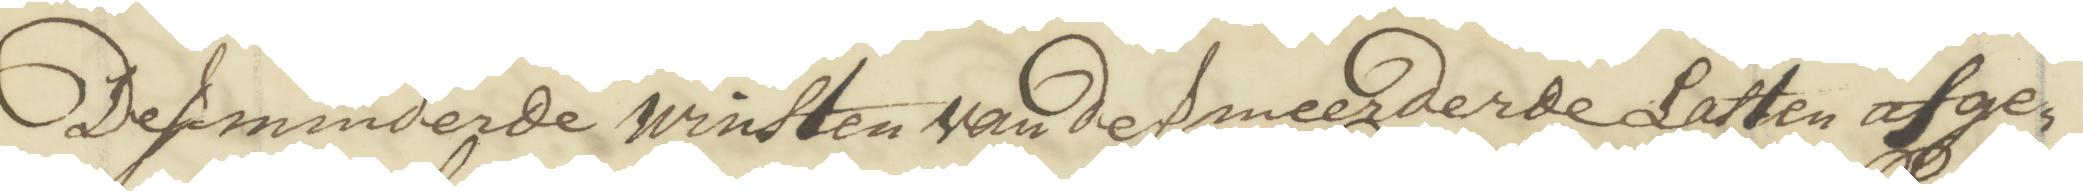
Desminderde winsten van devermeerderde Lasten afge„
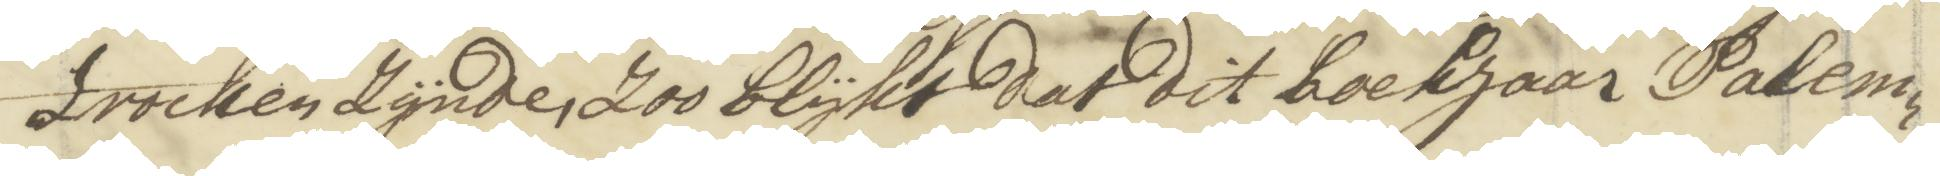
trocken zijnde, zoo blijkt dat dit boekjaar Palem„
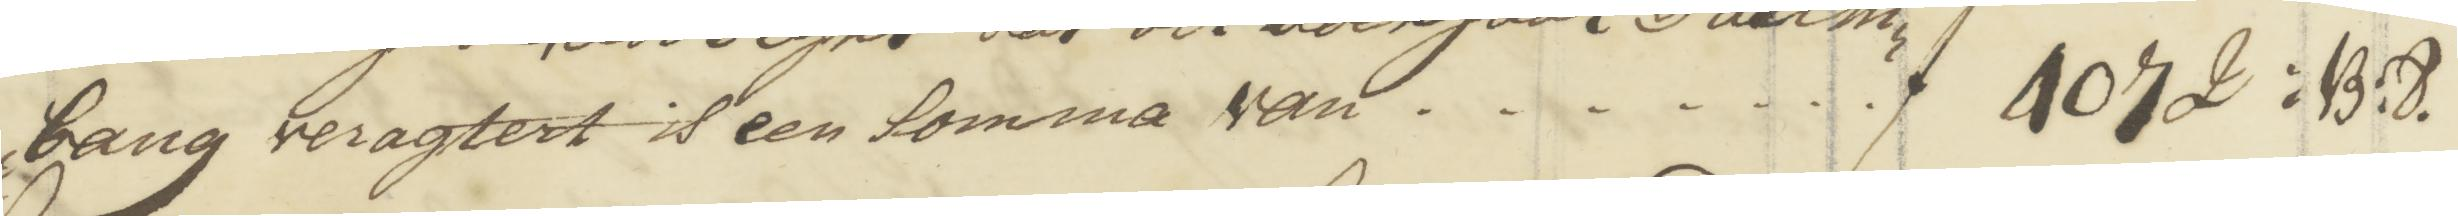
„bang veragtert is een somma van - - - - - - - ƒ 4072: 13: 8.
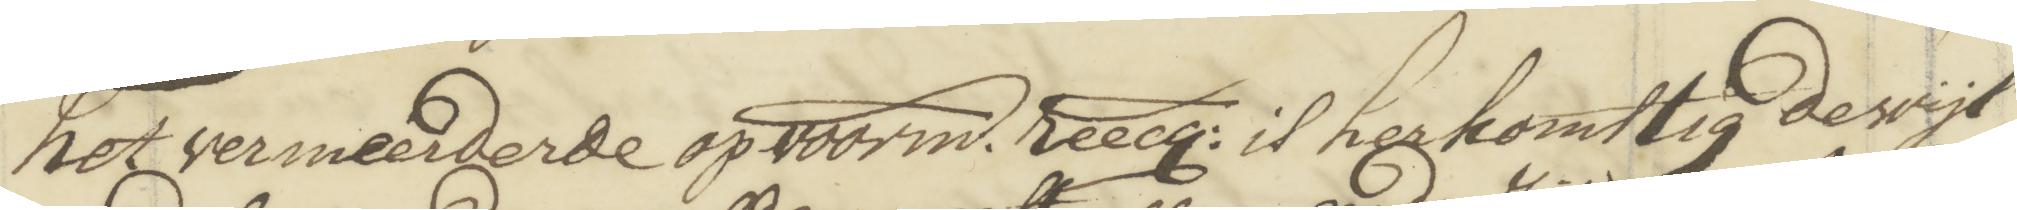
het vermeerderde op voorm. reecq: is herkomstig dewijl
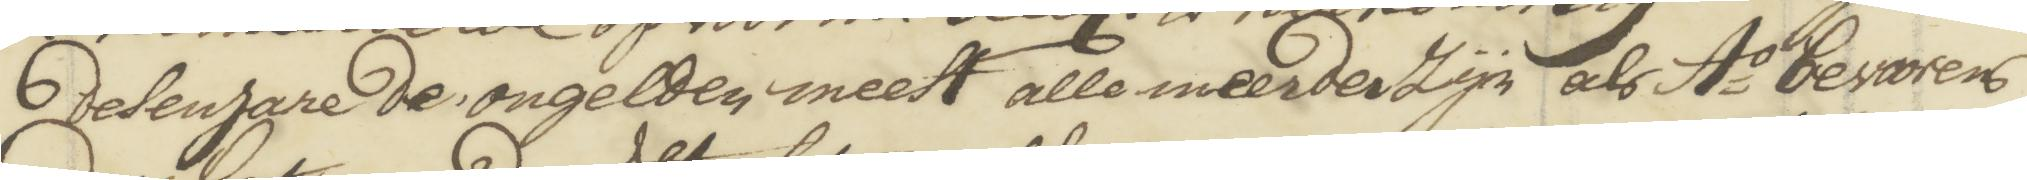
desenjare de ongelden meest alle meerder zijn als A=o bevoorens,
